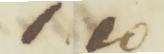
1.10
